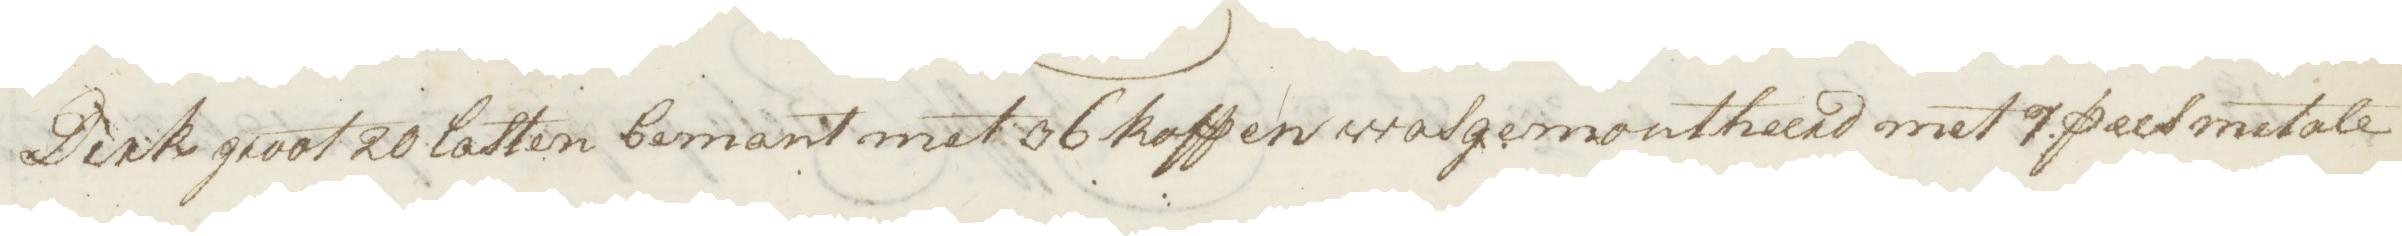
Dirk groot 20 lasten bemant met 36 koppen was gemontheerd met 7. pees metale
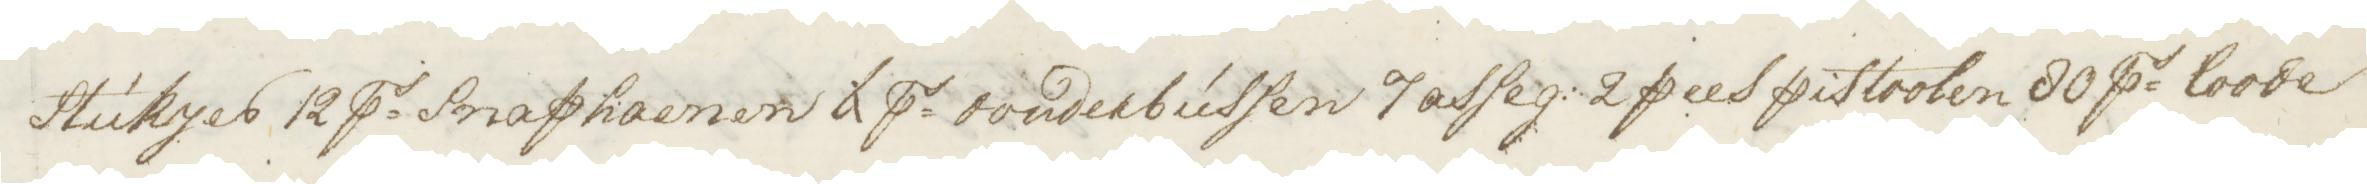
stukjes 12 p=s snaphaenen 4 p=s donderbussen 7 asseg: 2 pees pistoolen 80 p=s loode
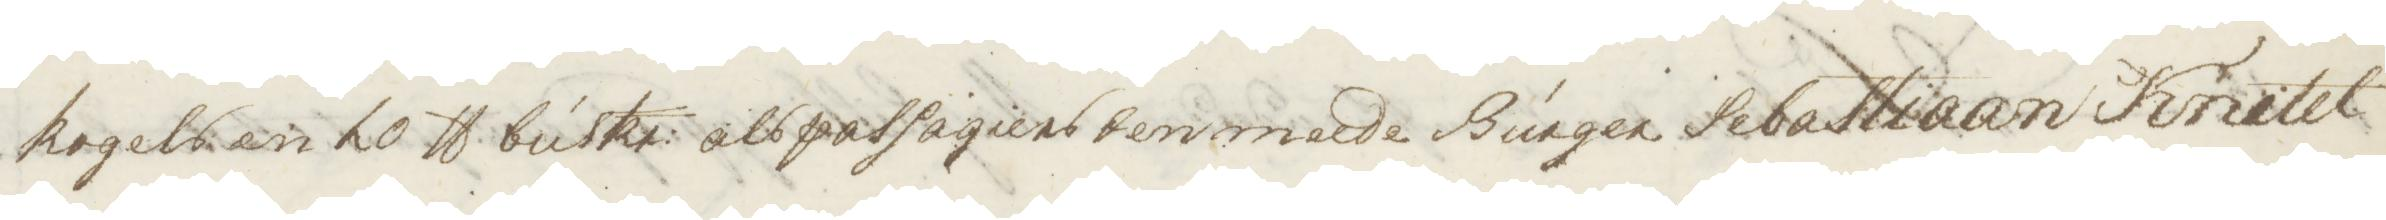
kogels en 40 lb: buskr: als passagiers den meede Burger Sebastiaan Knitel
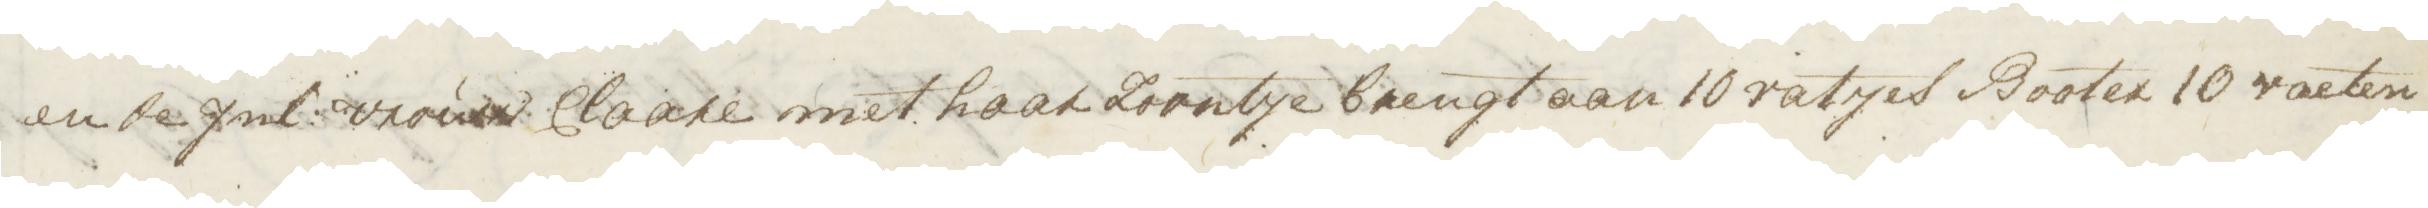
en de jnl: vrouw Claare met haar zoontje brengt aan 10 vatjes Booter 10 vaeten
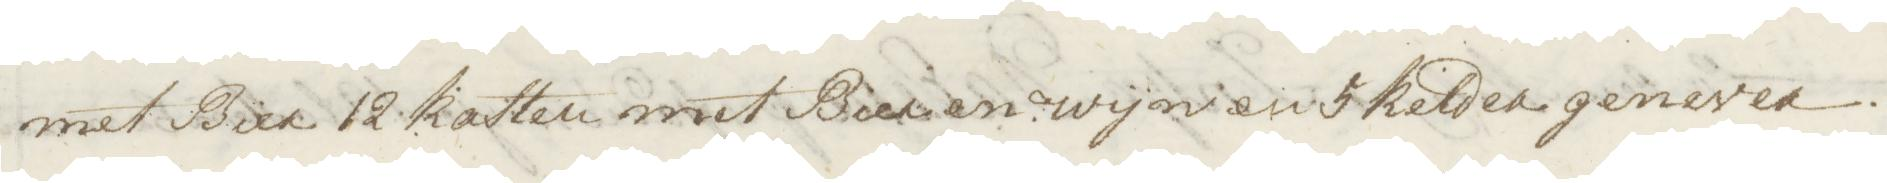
met Bier 12 kasten met Bier en wijn en 5 helder genever
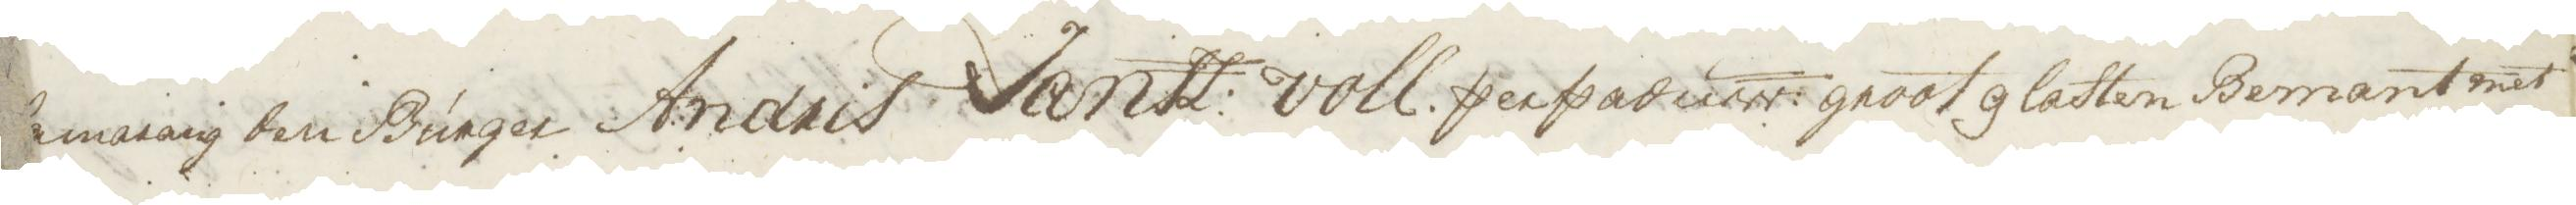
masang den Burger Andris Iansz: voll. per paduw: groot 9 lasten Bemant met
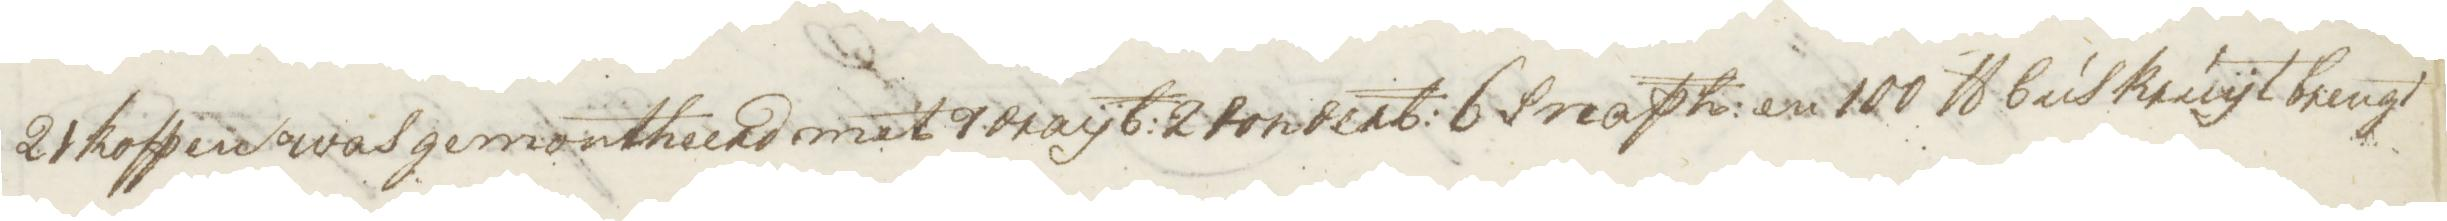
21 koppen was gemontheerd met 7 draijb: 2 donderb: 6 snaph: en 100 lb buskruijt brengt
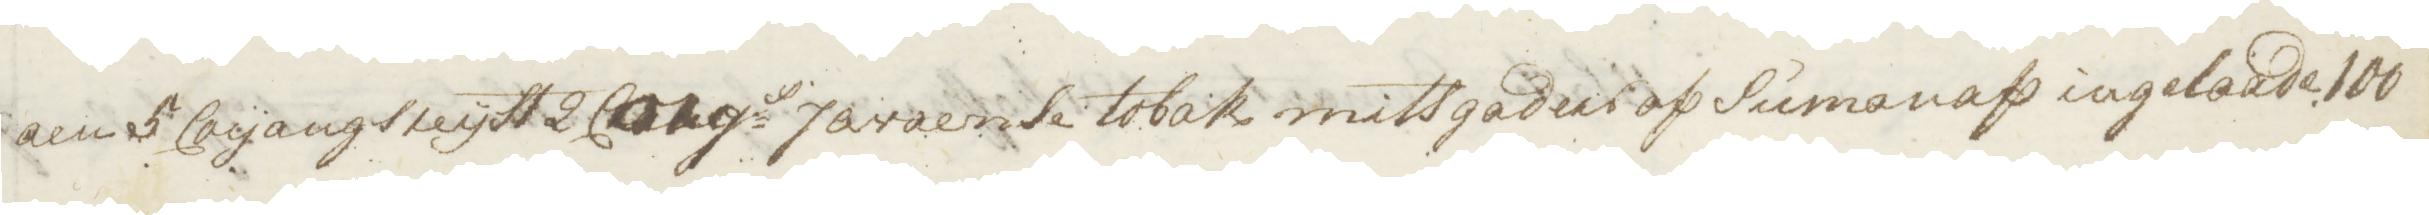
aen 5 Coijangs reijst 2 Carg=s Javaense tobak mitsgaders op sumanap ingelaade. 100
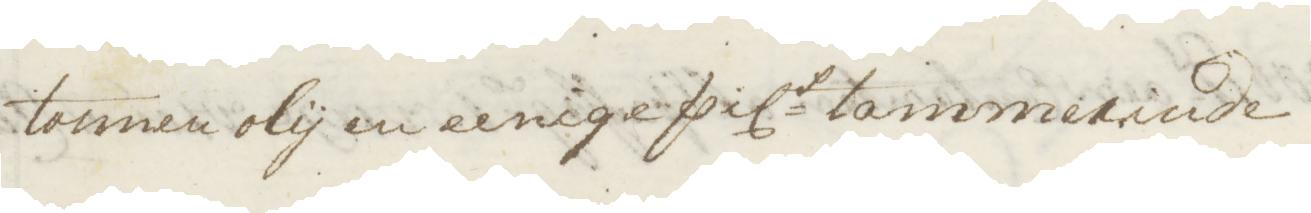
tonnen olij en eenige pic=s tammerinde
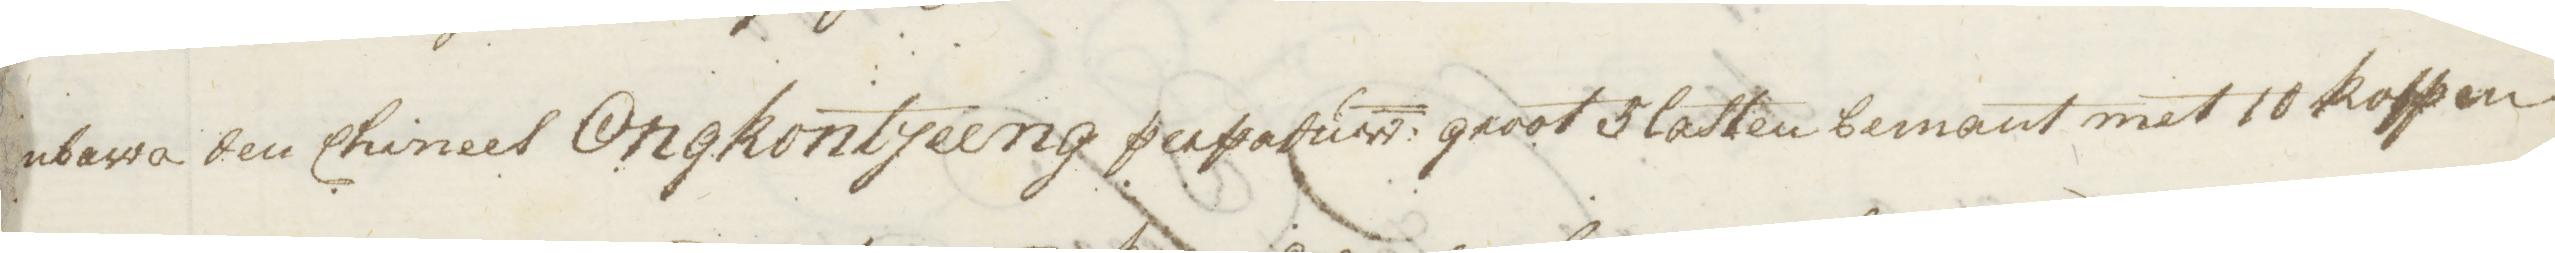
nbawa den Chinees Ongkontjeeng per paduw: groot 5 lasten bemant met 10 koppen
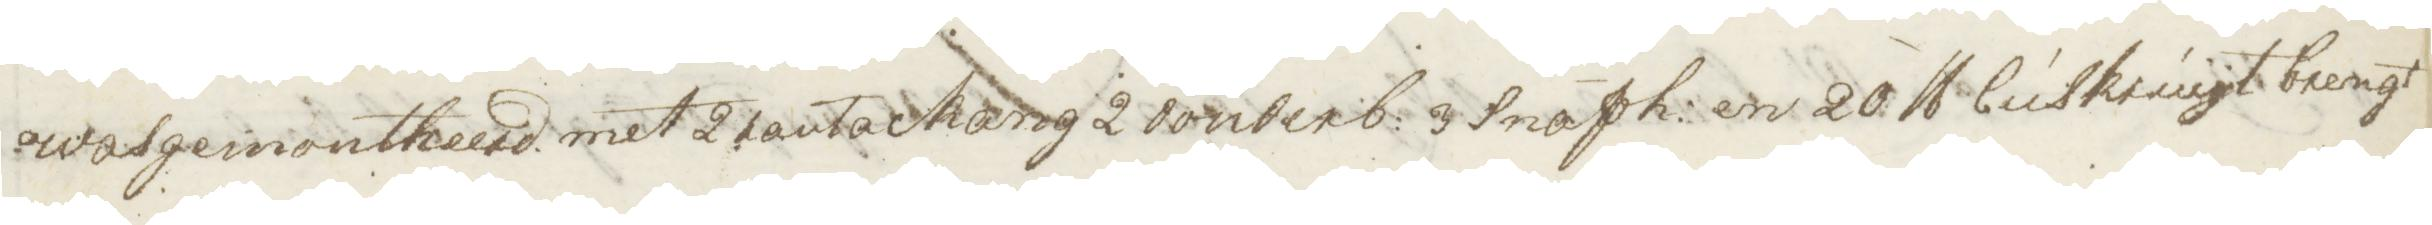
was gemontheerd met 2 rantoekang 2 donderb: 3 snaph: en 20: lb buskruijt brengt
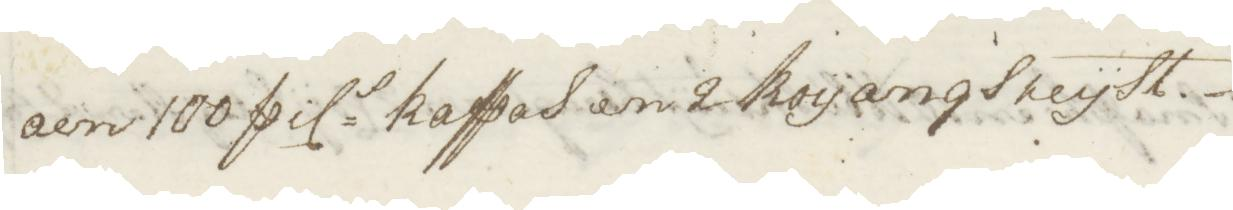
aen 100 pic:s kappas en 2 koijangs reijst.
